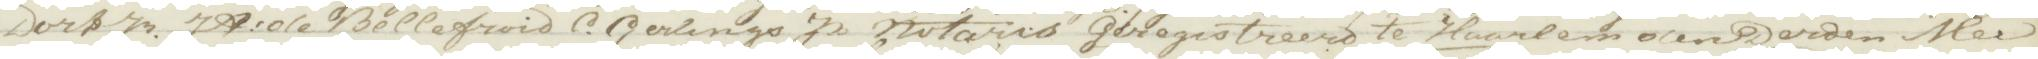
Dort Jr. J A: de Bellefroid C. Gerlings Jr. Notaris Geregistreerd te Haarlem den derden Mei
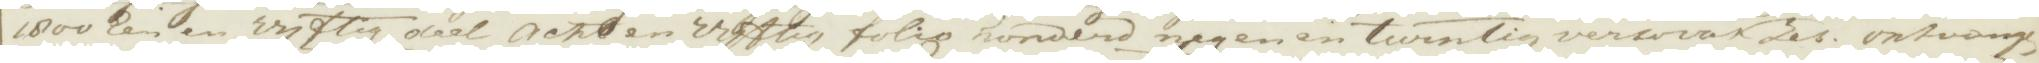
1800 Een en vyftig deel acht en vyftig folio honderd negen en twintig verso vak zes. ontvangen
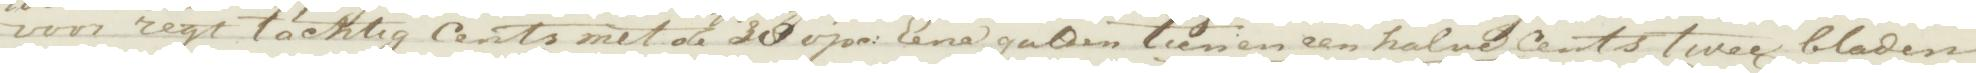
voor regt tachtig Cents met de 38 opc: Eene gulden tien en een halve Cents twee bladen
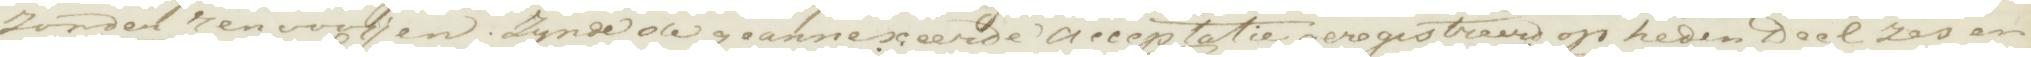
zonder renvooijen. zynde de geannexeerde acceptatie geregistreerd op heden Deel zes en
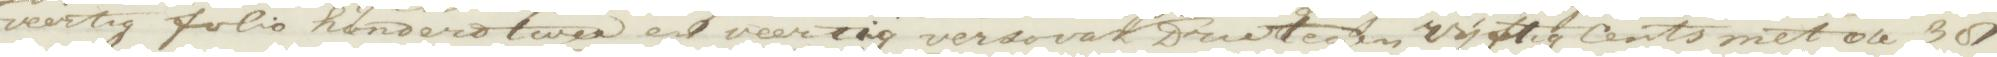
veertig folio honderd twee en veertig verso vak Drie tegen vijftig Cents met de 38
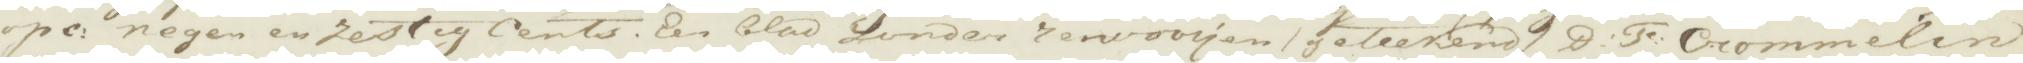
opc: negen en zestig Cents. Een blad zonder renvooijen / geteekend / D: F: Crommelin
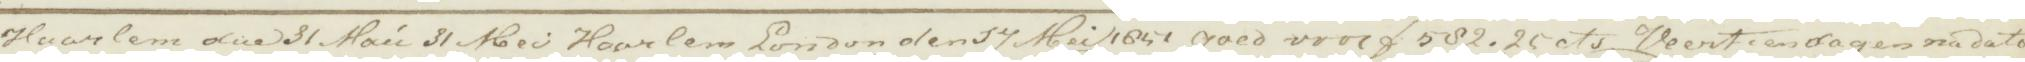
Haarlem die 31 Maij 31 Mei Haarlem London den 17 Mei 1851 goed voor ƒ 582. 25 cts. Veertien dagen na dato
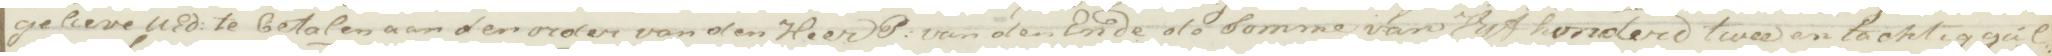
gelieve uEd: te betalen aan den order van den Heer P: van den Ende de somme van Vyfhonderd twee en tachtig gul„
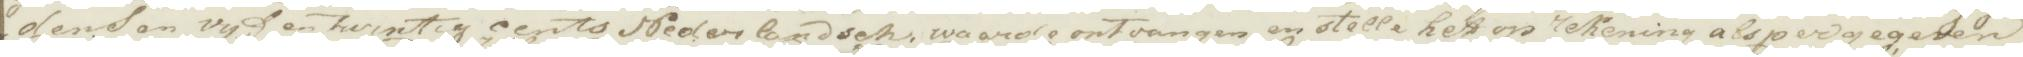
dens en vyf en twintig cents Nederlandsch, waarde ontvangen en stelle het op rekening als per gegeven
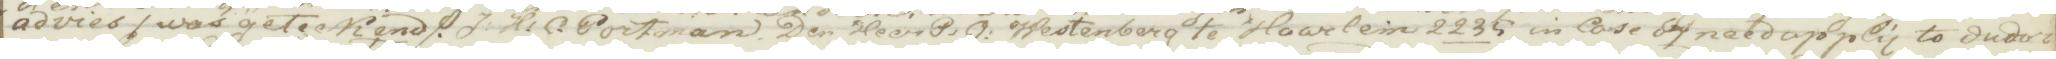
advies / was geteekend /. J: H: C. Portman Den Heer P: J: Westenberg te Haarlem 2235 in Case of need applij to order
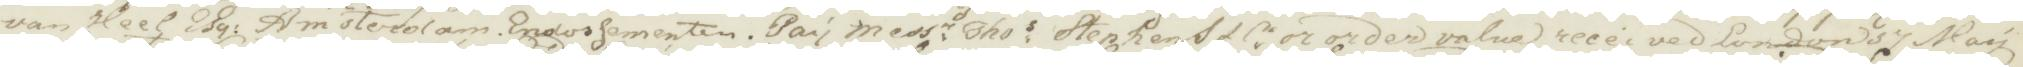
van Heel Esq: Amsterdam. Endossementen, Paij mess:r Tho„s Stephens & C: or order value received London 17 Maij
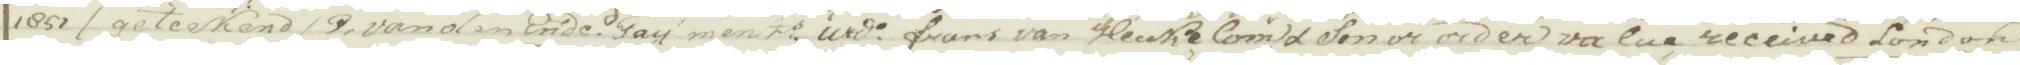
1851 / geteekend / P. van den Ende. Paijment„s uEd: frans van Heukelom & Son or order value received London
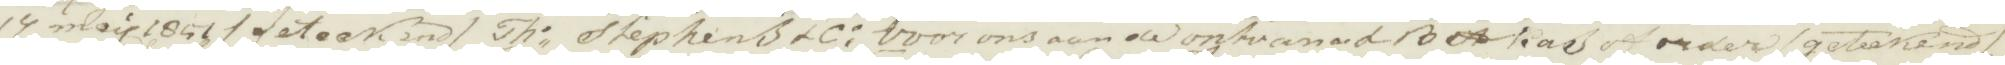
17 maij 1851 / geteekend / Th„s Stephens & C„o voor ons aan de ontvangen Betkas of order / geteekend /
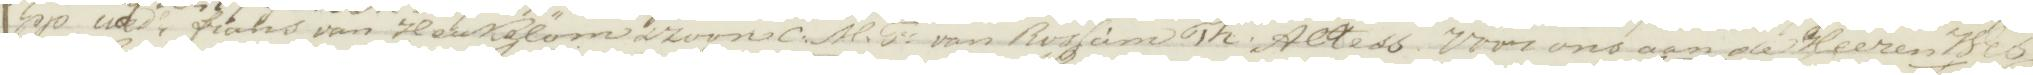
pp ued„e frans van Heukelom & zoon C: M: G: van Rossum Th. Altess Voor ons aan de Heeren Wes
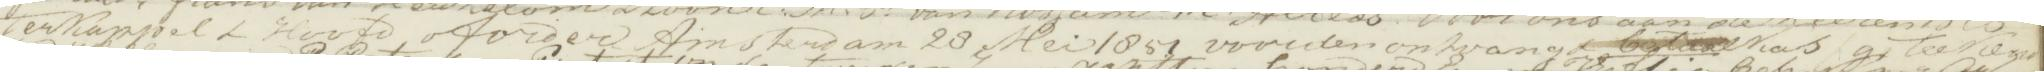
terkappel & Hoofd of order Amsterdam 28 Mei 1851 voor den ontvang betaalkas geteekend
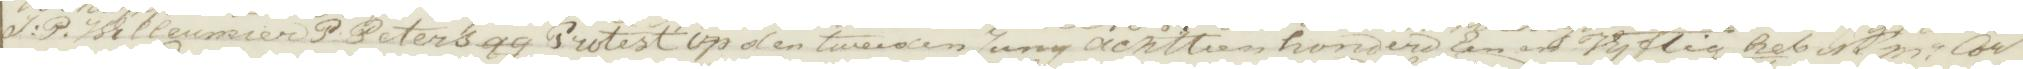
I: P. Willenmier P. Peters qq Protest op den tweeden Juny achttien honderd Een en Vyftig heb ik m.r Cor
